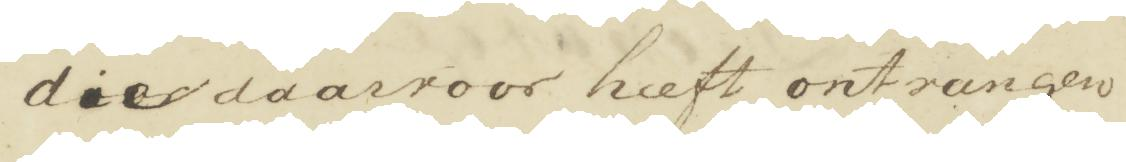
die daarvoor heeft ontvangen
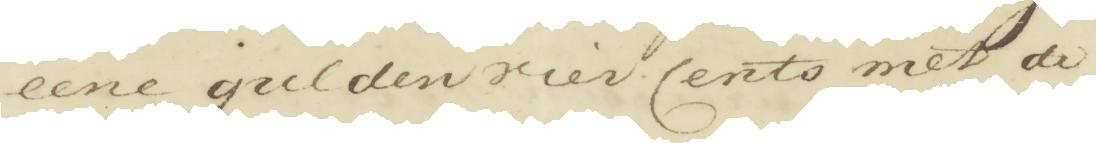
eene gulden vier cents met de
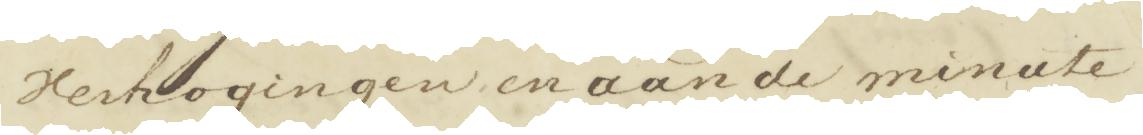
Verhogingen en aan de minute
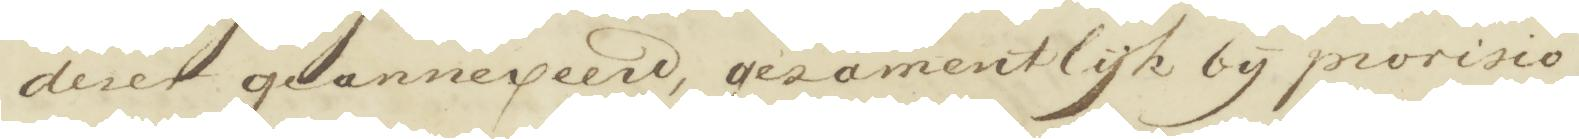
dezes geannexeerd, gezamentlijk bij provisio
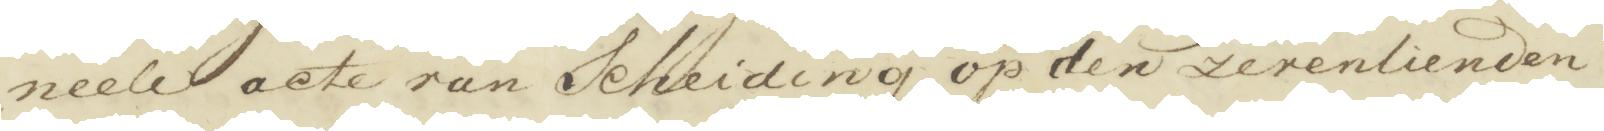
neele acte van Scheiding, op den zeventienden
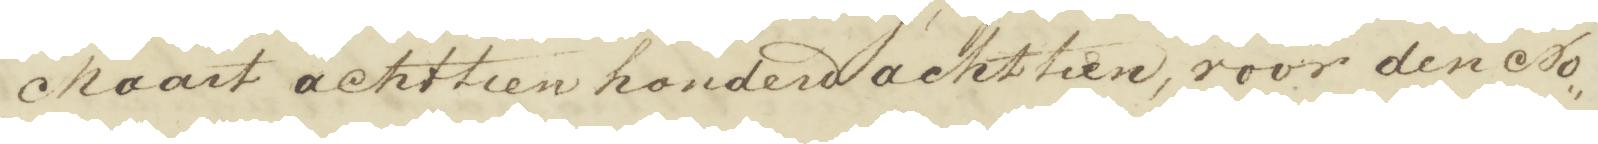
Maart achttien honderd achttien, voor den No„
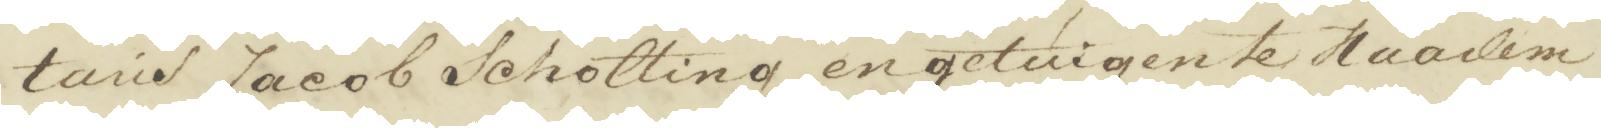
taris Jacob Scholting en getuigen te Haarlem
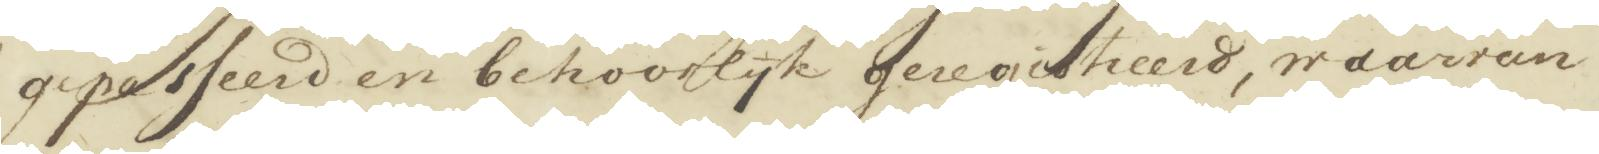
gepasseerd en behoorlijk geregistreerd, waarvan
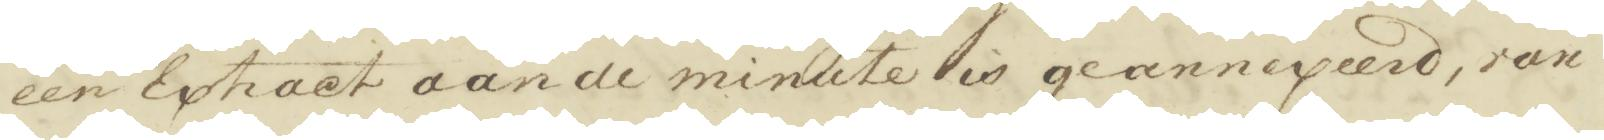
een Extract aan de minute is geannexeerd, van
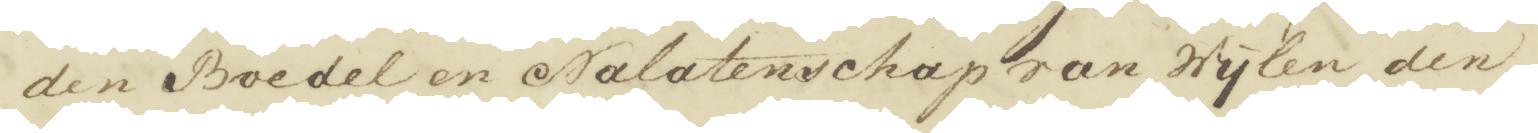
den Boedel en Nalatenschap van wijlen den
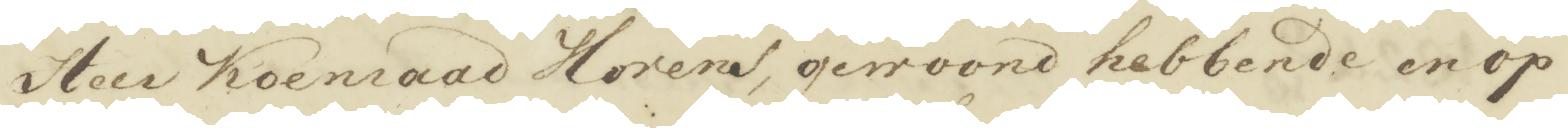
Heer Koenraad Hovens, gewoond hebbende en op
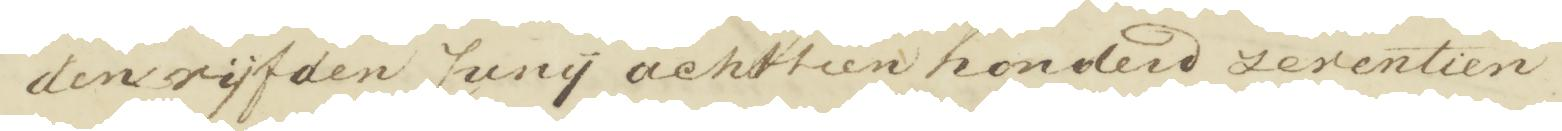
den vijfden Junij achttien honderd zeventien
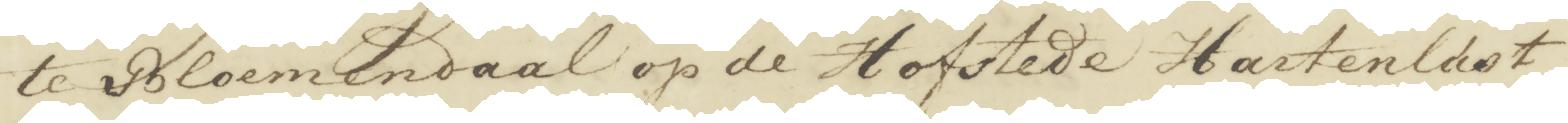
te Bloemendaal op de Hofstede Hartenlust
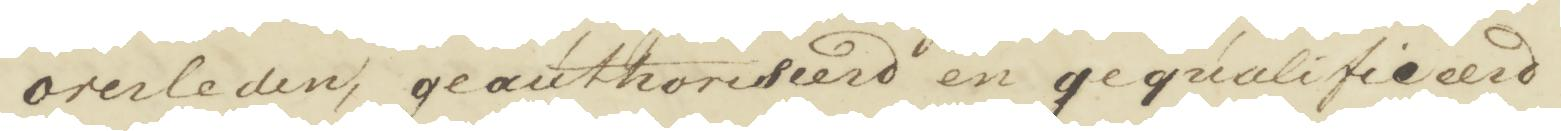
overleden, geauthoriseerd en gequalificeerd
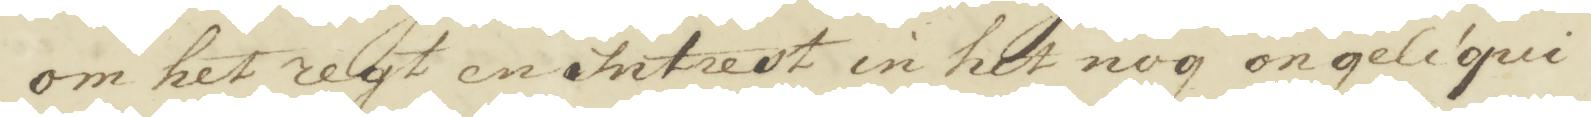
om het regt en Intrest in het nog ongeliqui
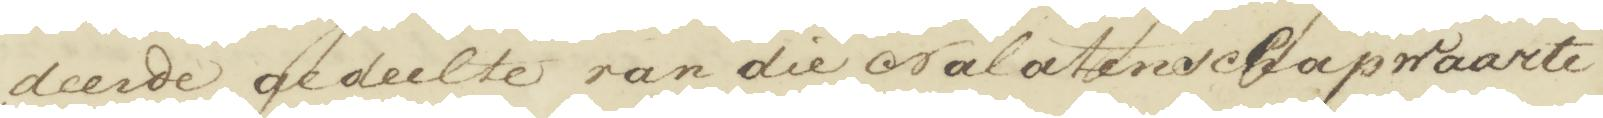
deerde gedeelte van die Nalatenschap waarte
